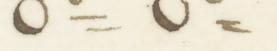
d=o d=o
